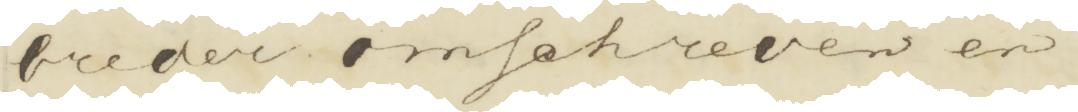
breder omschreven en
